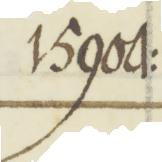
15904:3:_
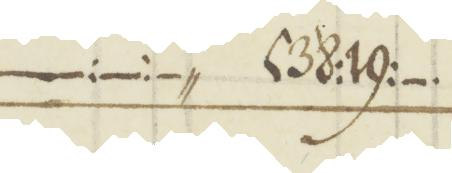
_:_:_„ 538.19:_.
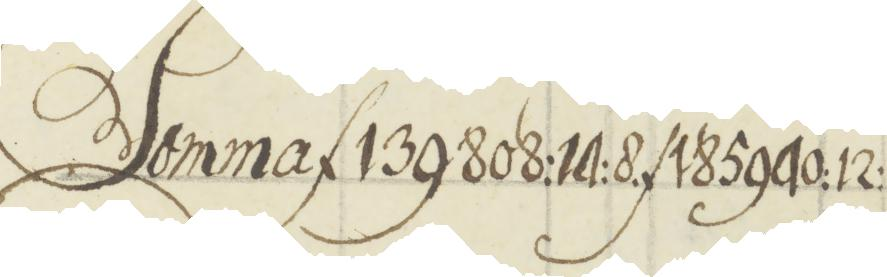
Somma ƒ139808:14:8. ƒ1859012:
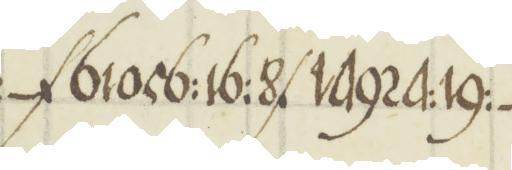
ƒ61056:16:8.ƒ14924:19:_.
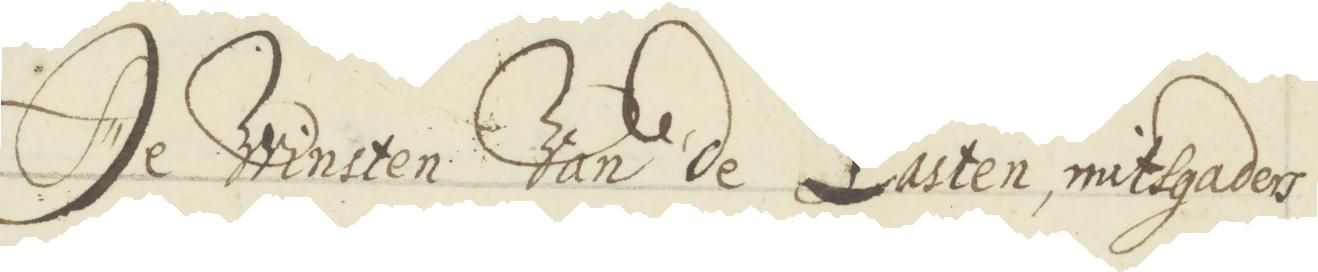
De Winsten Van de Lasten, mitsgaders
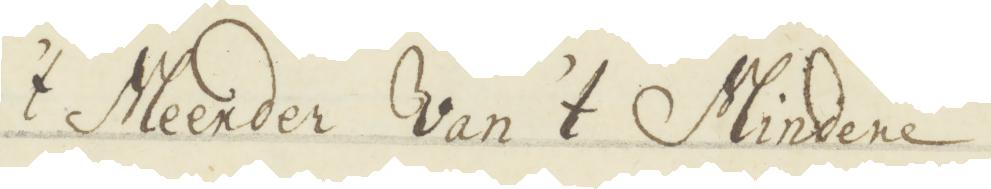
't Meerder van ’t Mindere
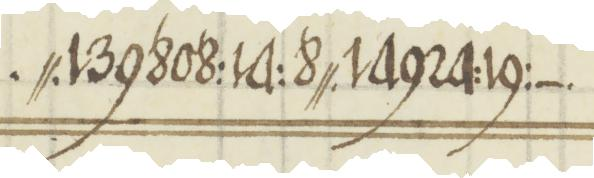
.„.139808:14:8„14924:19:_.
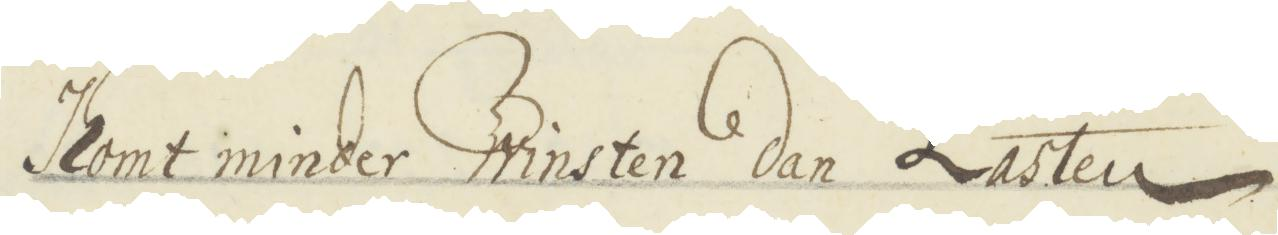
Komt minder Winsten dan Lasten
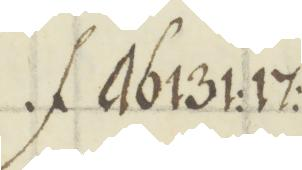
ƒ46131:17:8
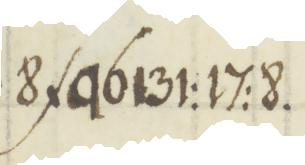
ƒ46131:17:8.
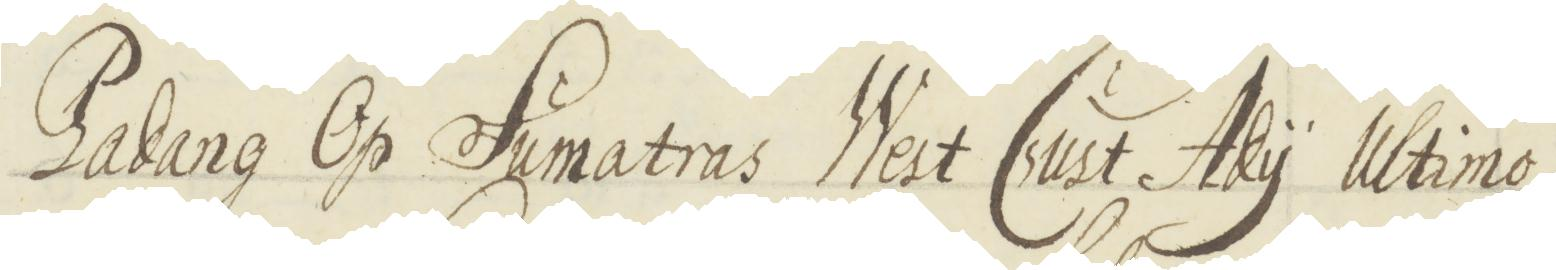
Padang Op Sumatras West Cust Adij Ultimo
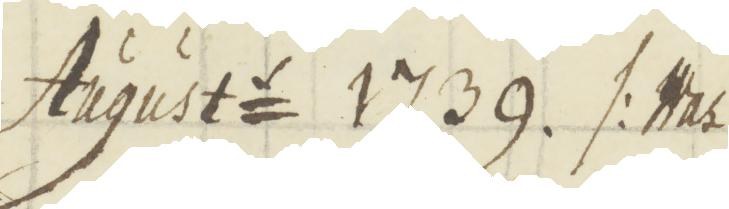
August=s 1739. /:Was Ge
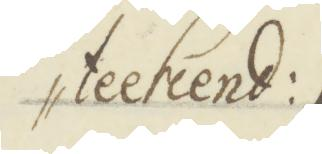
„teekend:)
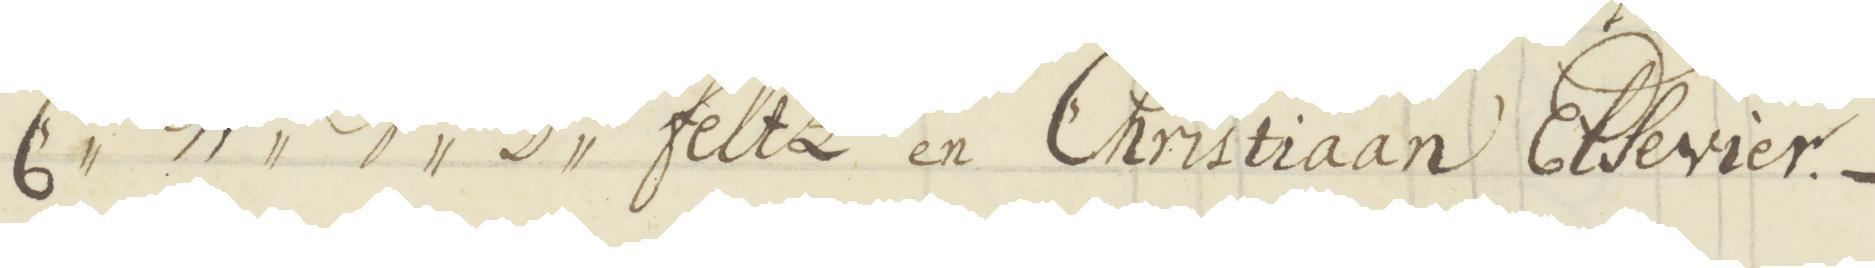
C„n W„m D„r feltz en Christiaan Elsevier. _
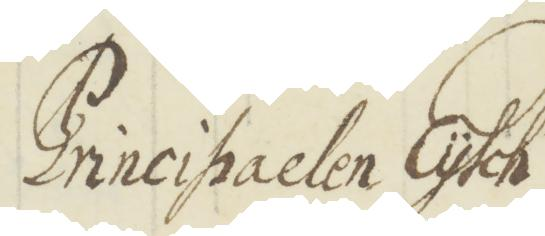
Principaelen Eijsch
